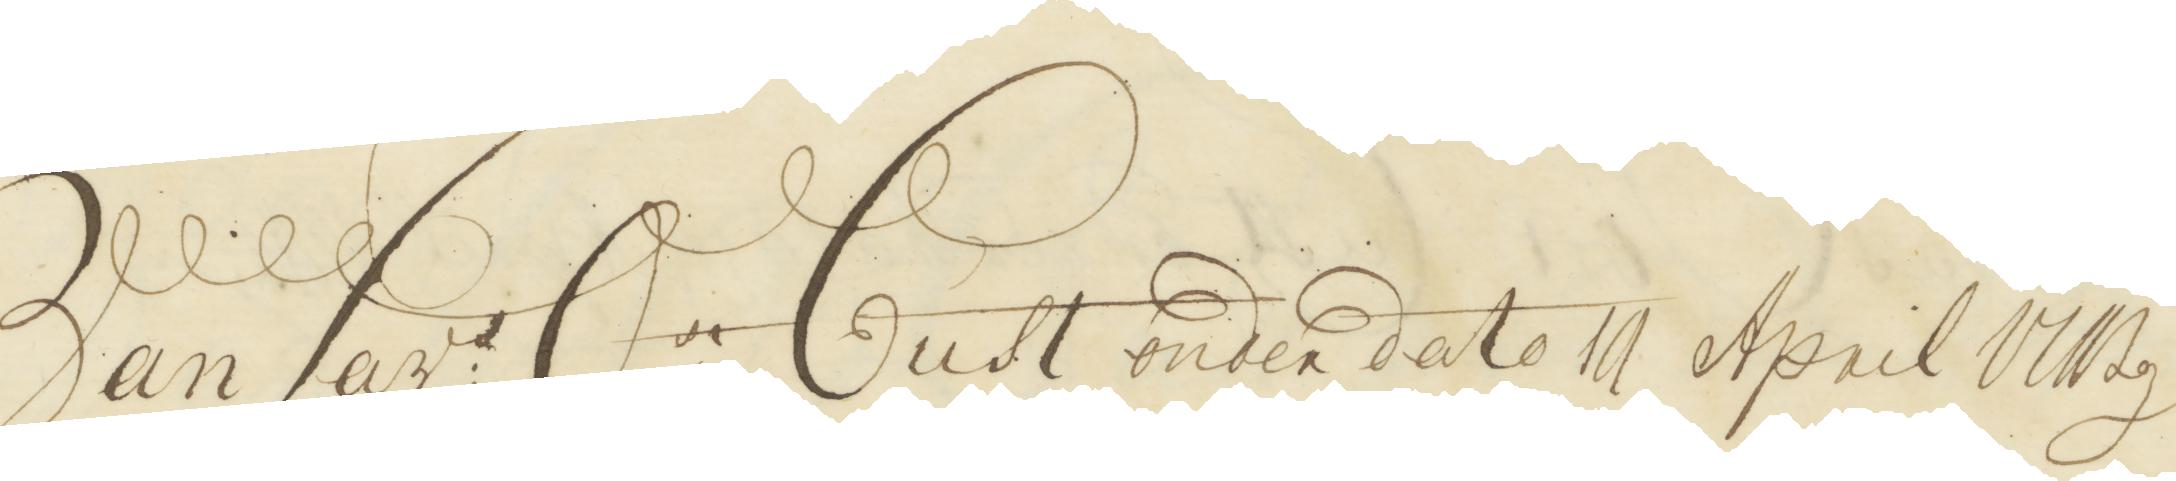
Van Jav:s O„st Cust onder dato 14 April 1742
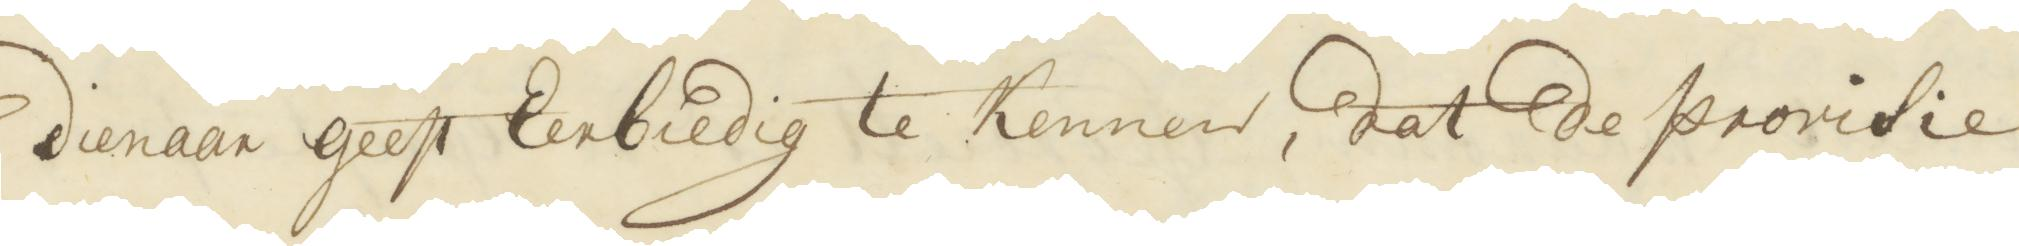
dienaar geeft Eerbiedig te kennen, dat de provisie
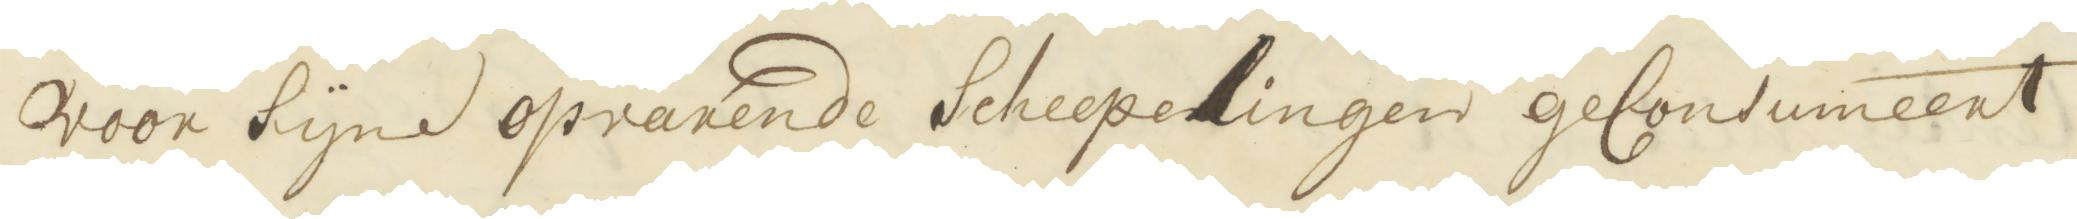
voor sijne opvarende scheepelingen geconsumeert
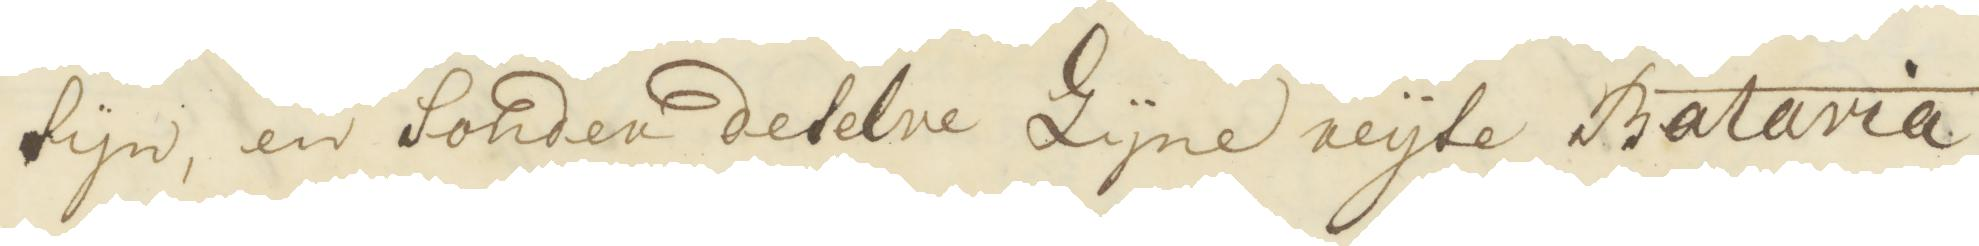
sijn, en sonder deselve zijne reijse Batavia
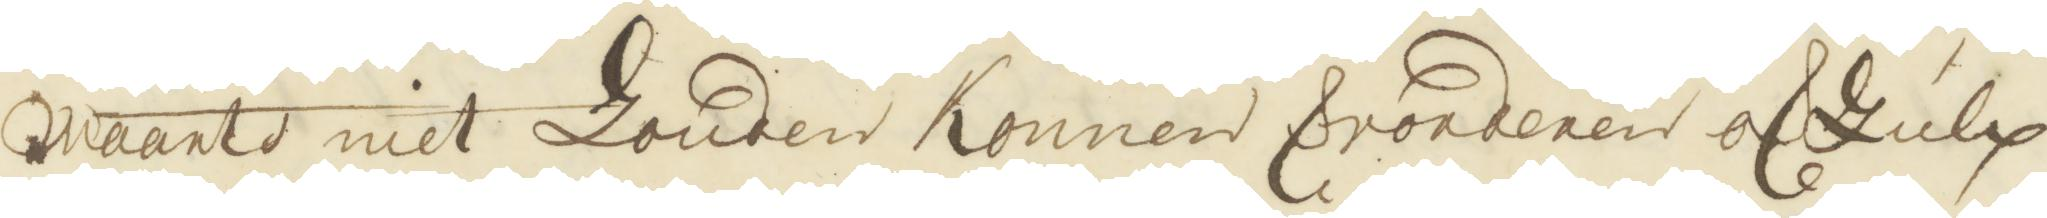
waarts niet zouden konnen vervorderen overzulx
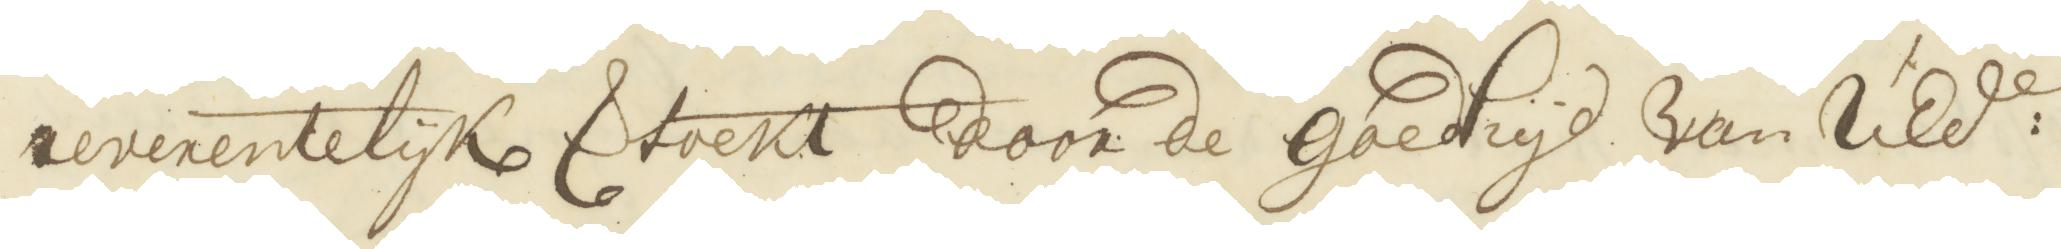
reverentelijk versoekt door de goedhijd van uEd:e
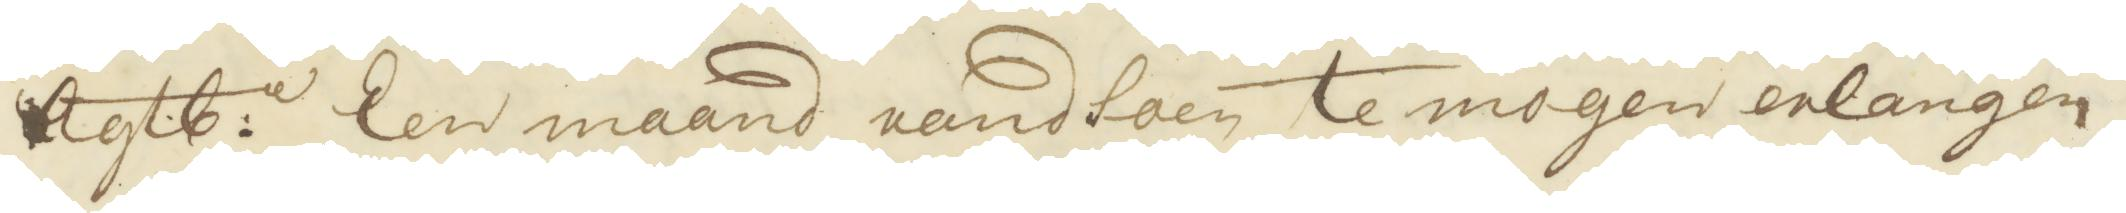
agtb:e Een maand randsoen te mogen erlangen
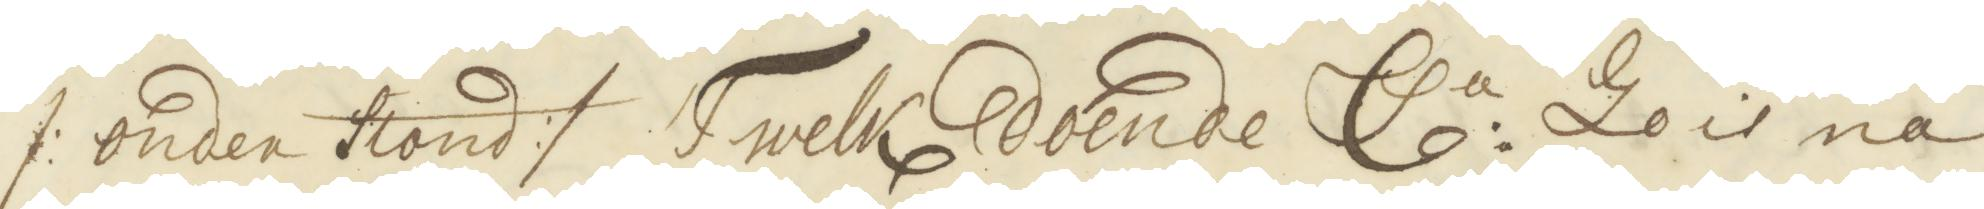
/:onder stond:/ 'T welk doende &:a zo is na
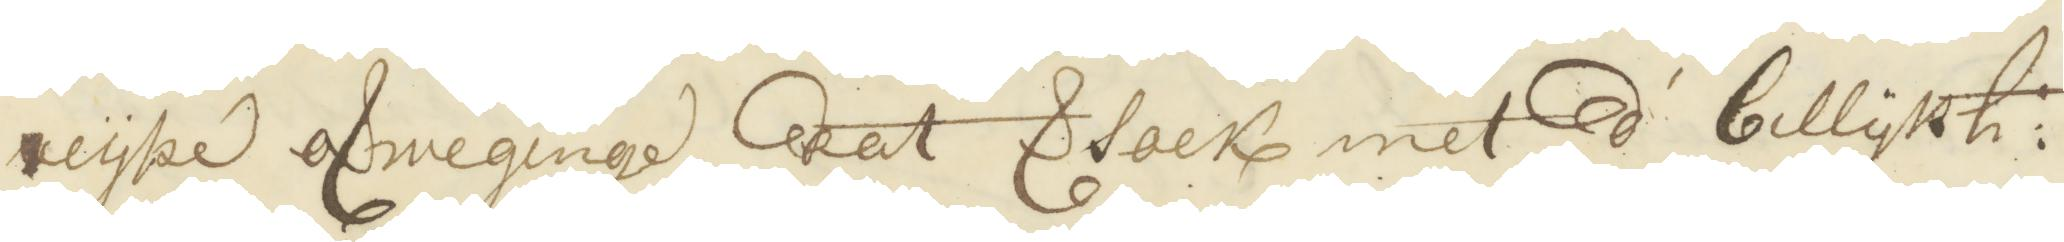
reijpe overweginge dat versoek met d’ bellijkh:t
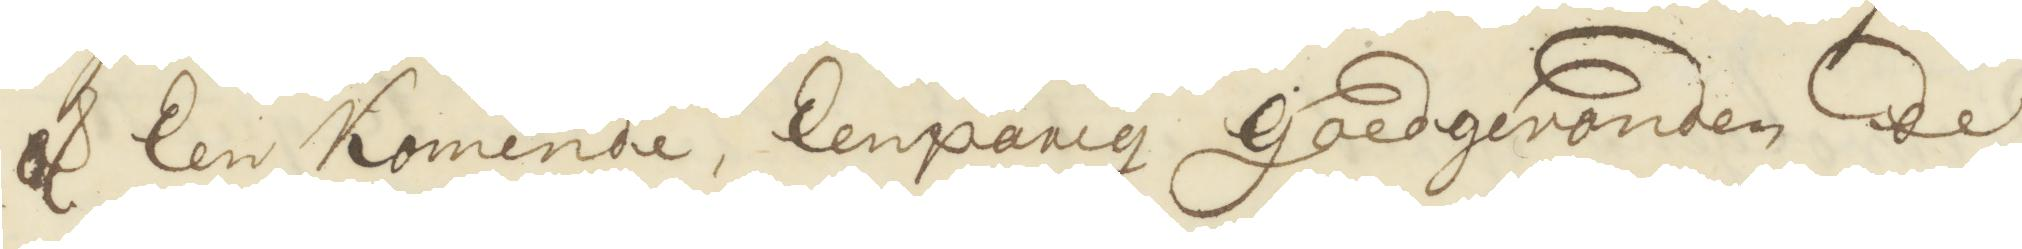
over Een komende, Eenparig goedgevonden de
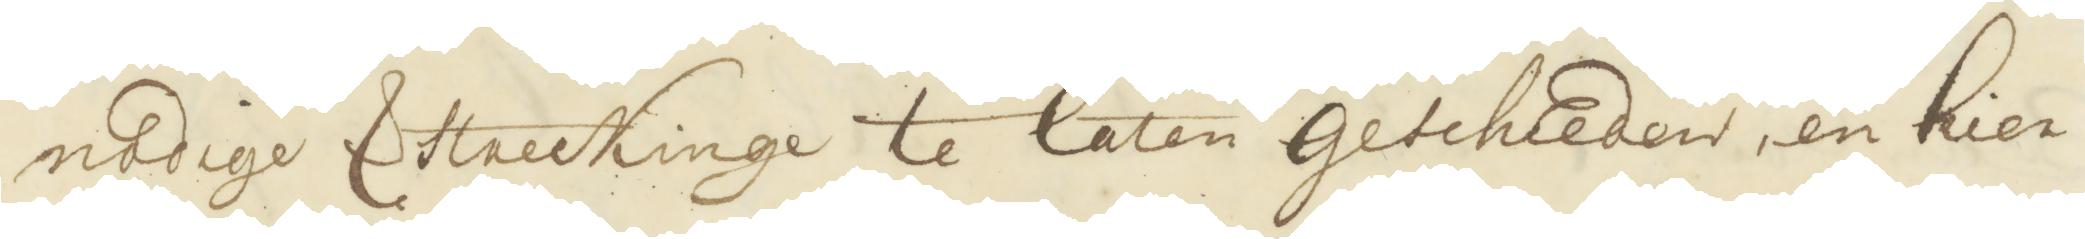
nodige verstreckinge te laten geschieden, en hier
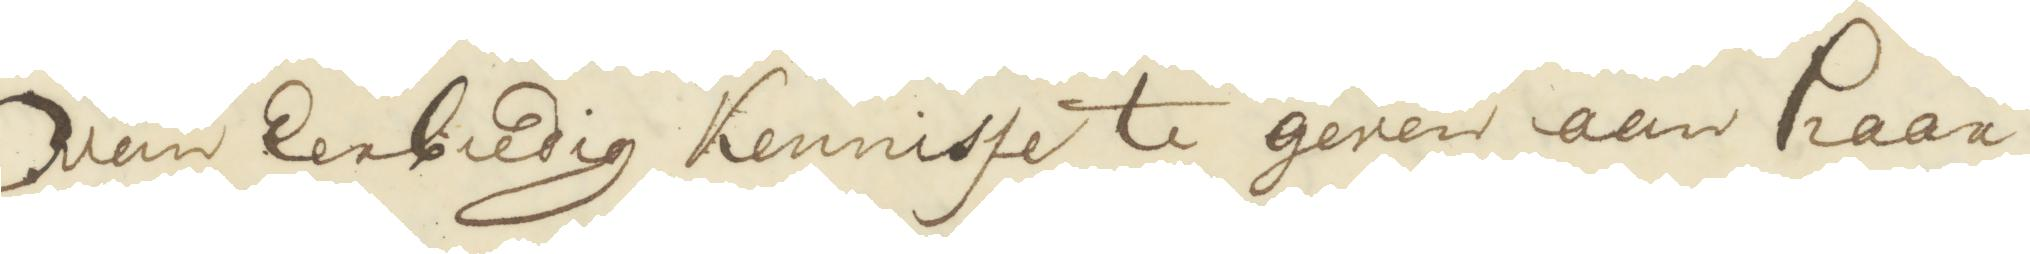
van Eerbiedig kennisse te geven aan haar
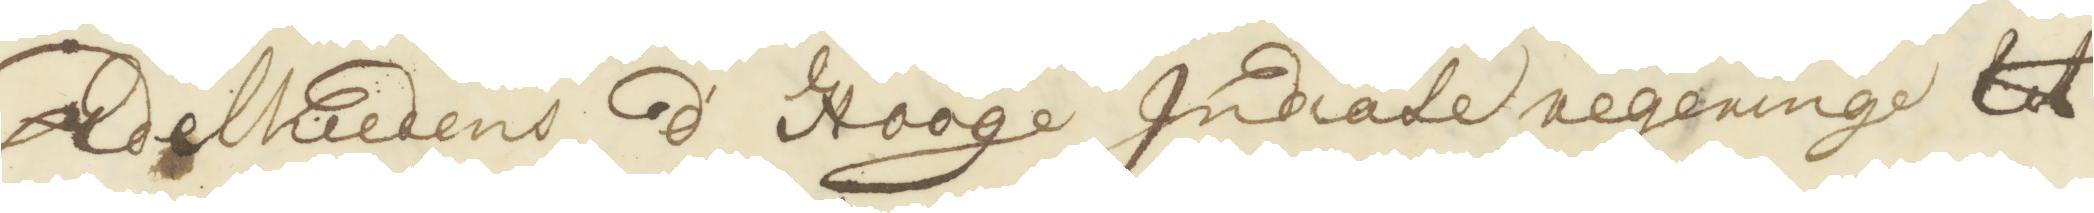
Edelheedens d’ Hooge Jndiase regeringe tot
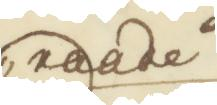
raade
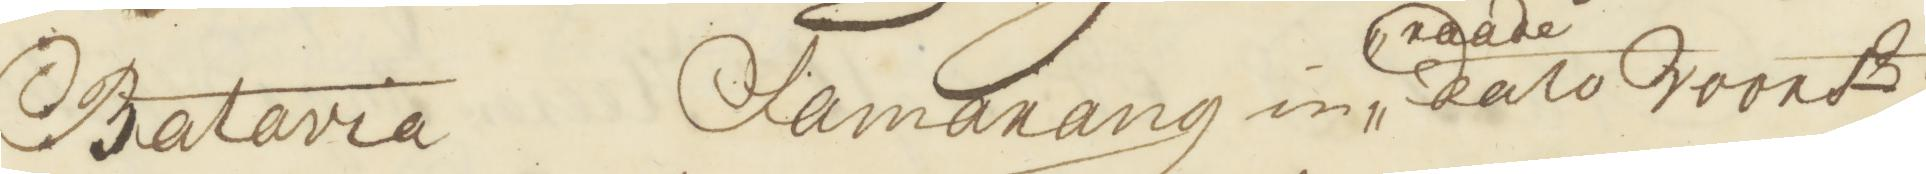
Batavia Samarang in „ dato voorsz
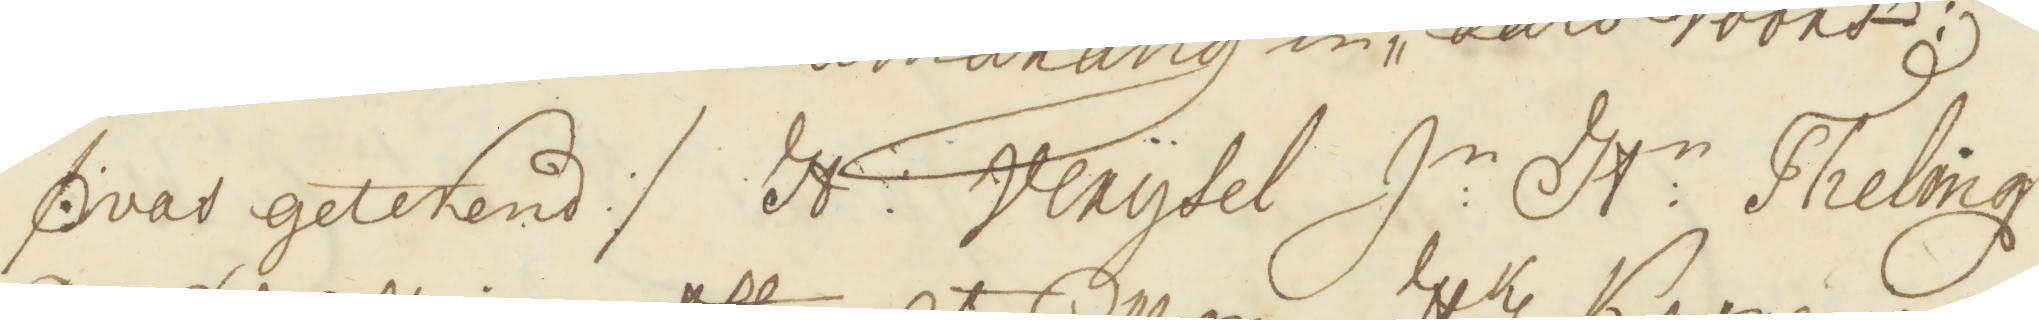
/:was getekend:/ H: Verijsel J:n H:n Theling
